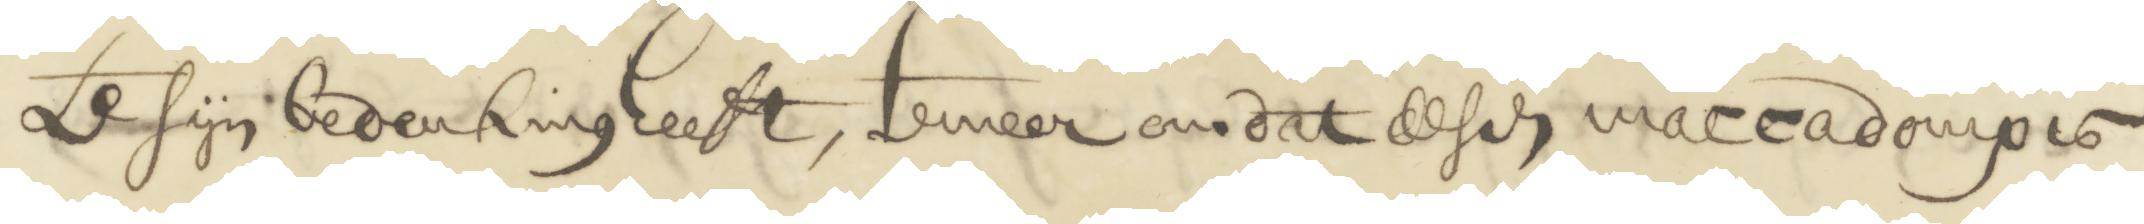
te sijn bedenking heeft, te meer om dat desen maccadompis
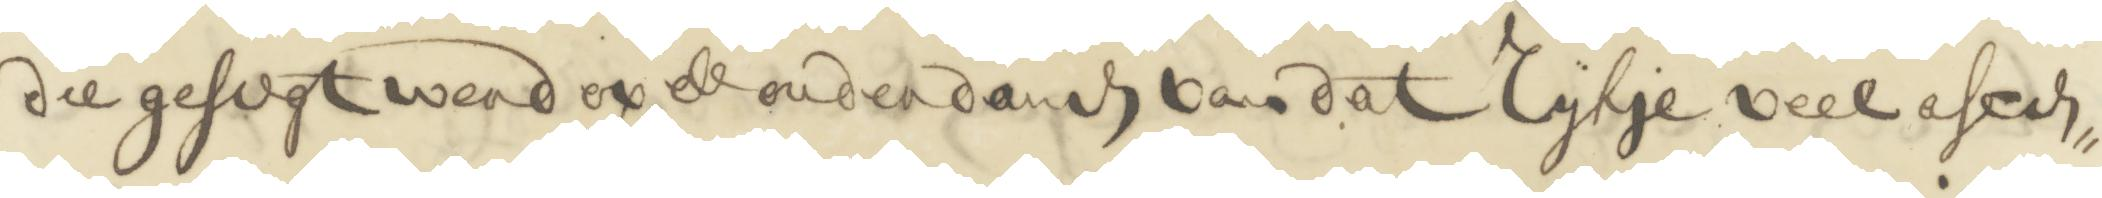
die gesegt werd op de onderdanen van dat Rijkje veel ascen„
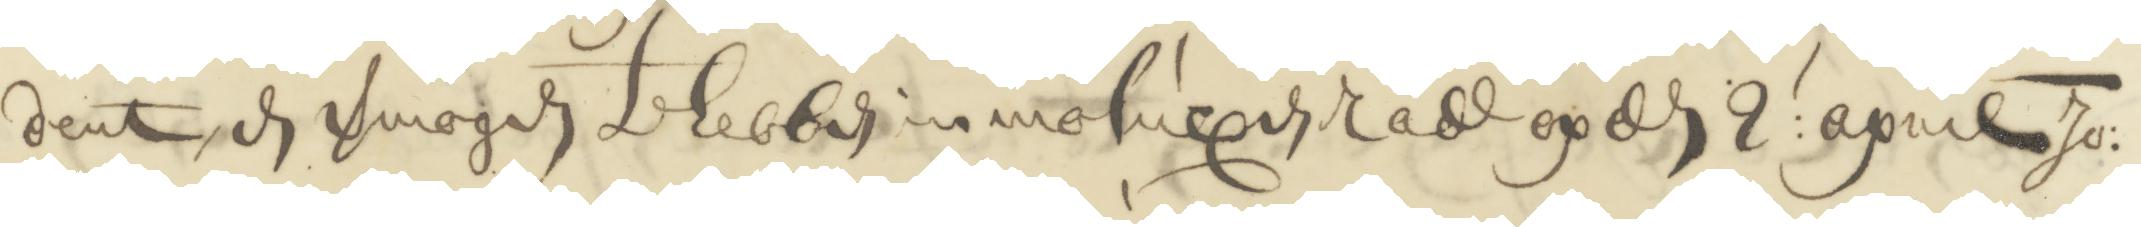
dent, en vermogen te hebben in moluxen Rade op den 2:' april Jo:
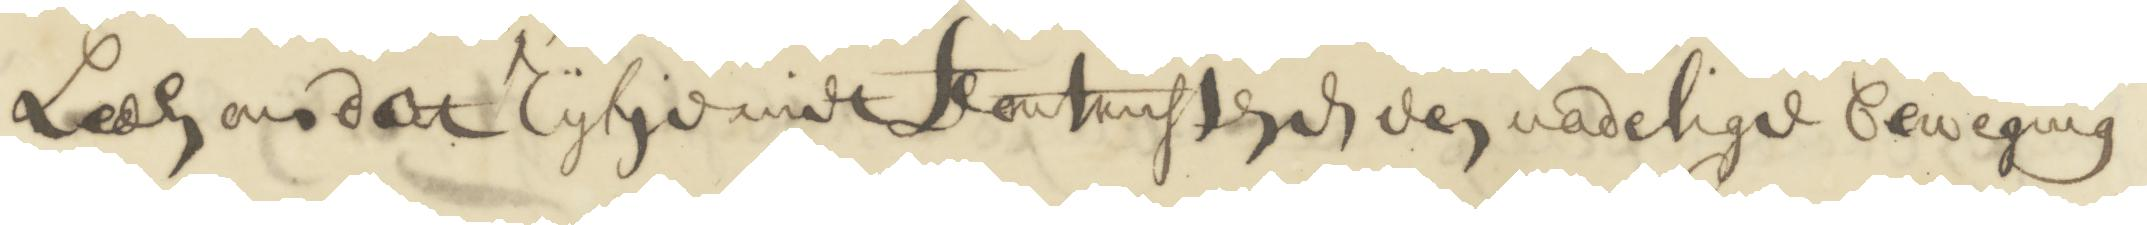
Leden om dat Rijkje niet te ontrusten en een nadelige beweging
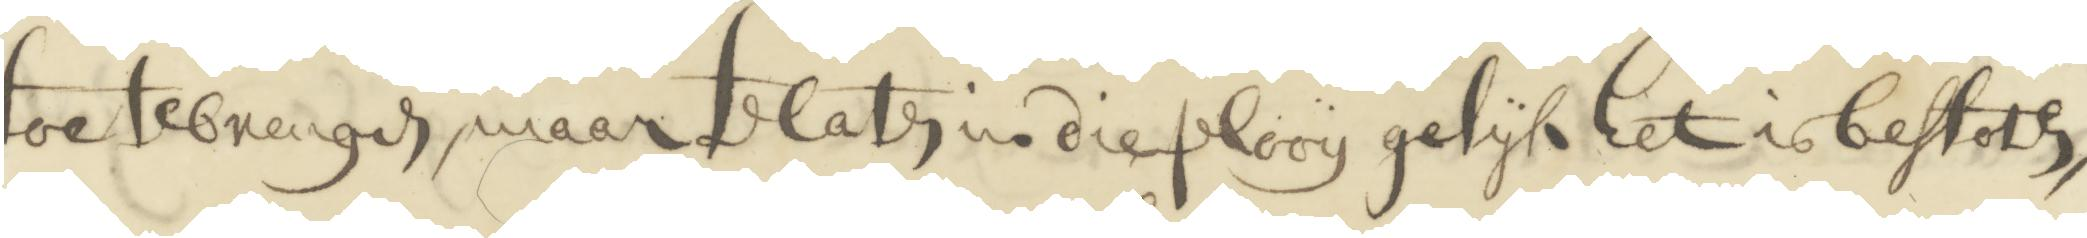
toe te brengen, maar te laten in die plooij gelijk het is besloten,
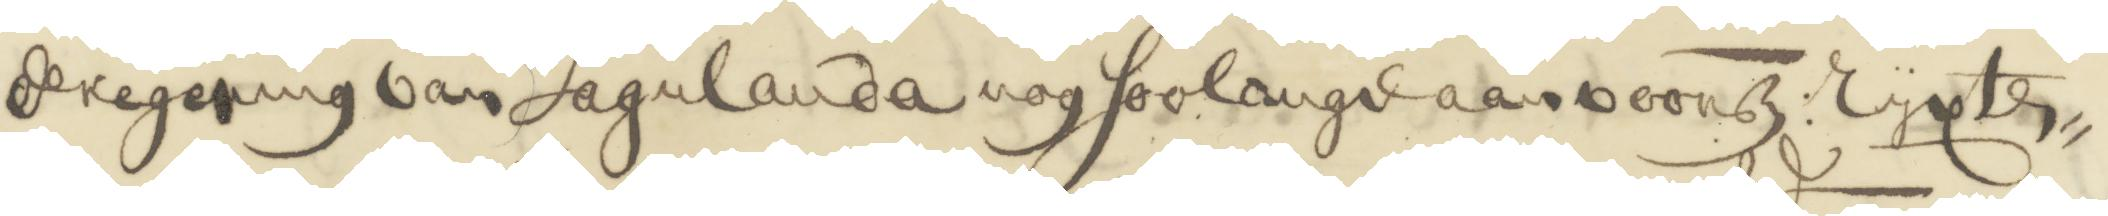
de regering van Tagulanda nog Soo lange aan voorsz: rijxten„
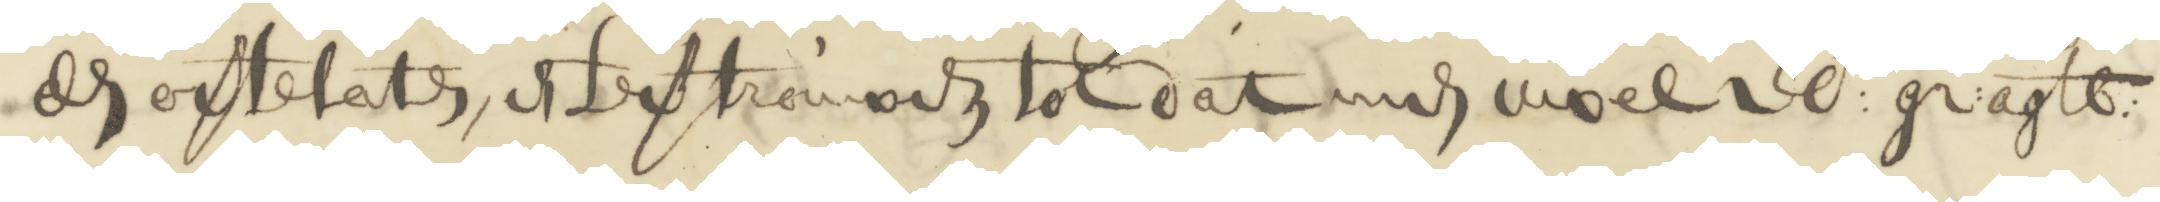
den over te laten, en te vertrouwen tot dat men uwel Ed: gr: agtb:
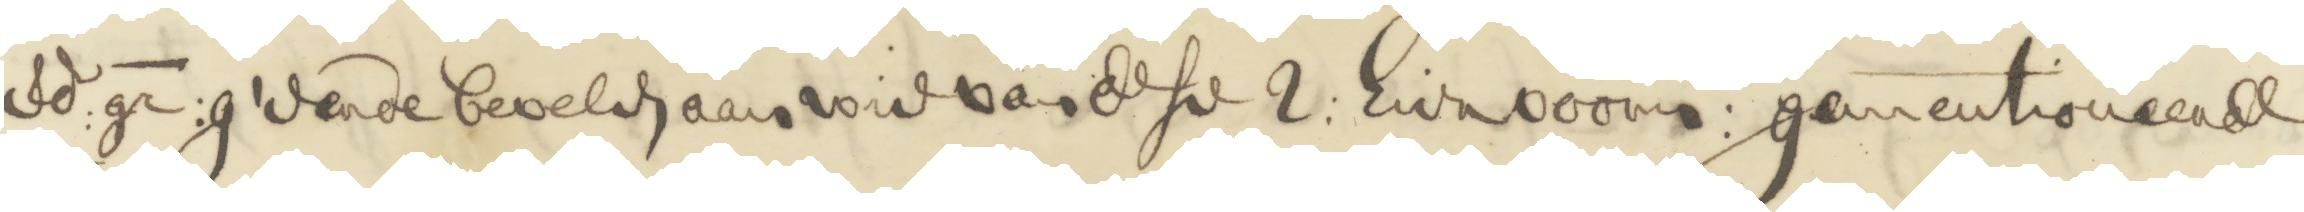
Ed: gr: g’eerde bevelen aan wie van dese 2: hier voorn: gementioneerde
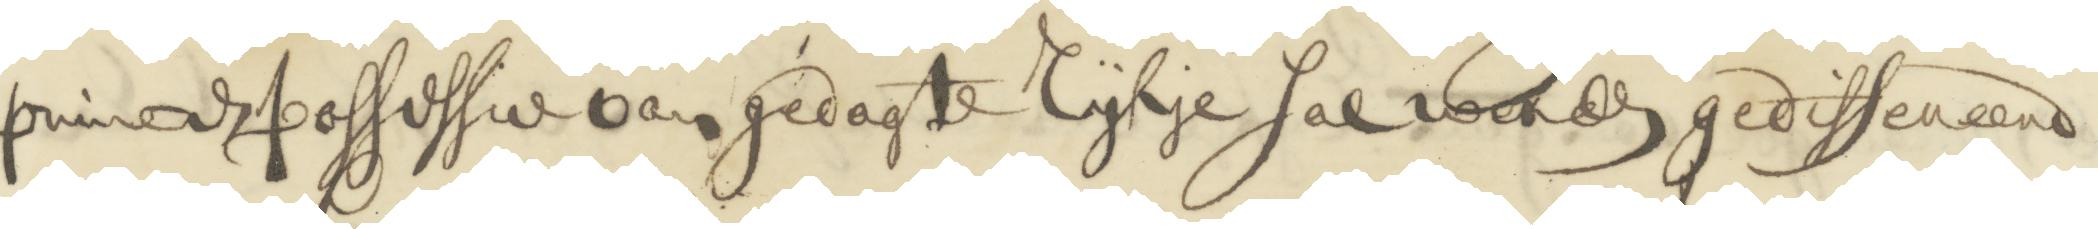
prince possessie van gedagte Rijkje Sal werden gediffereerd
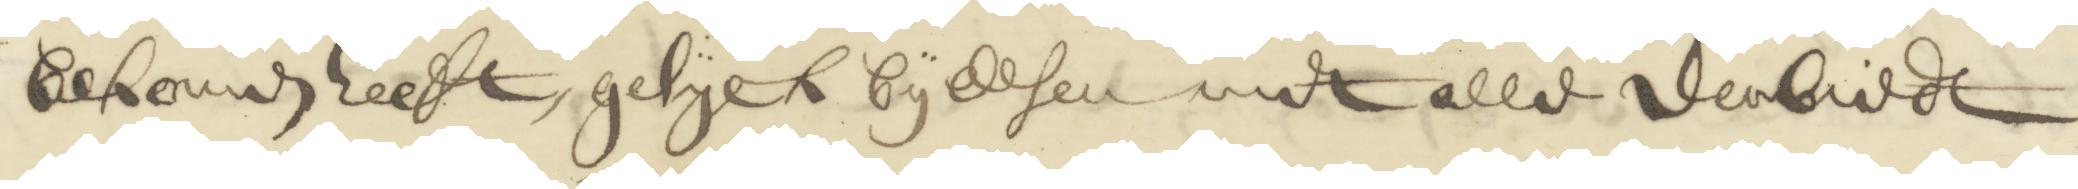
bekomen heeft, gelijck bij desen met alle Eerbiedt
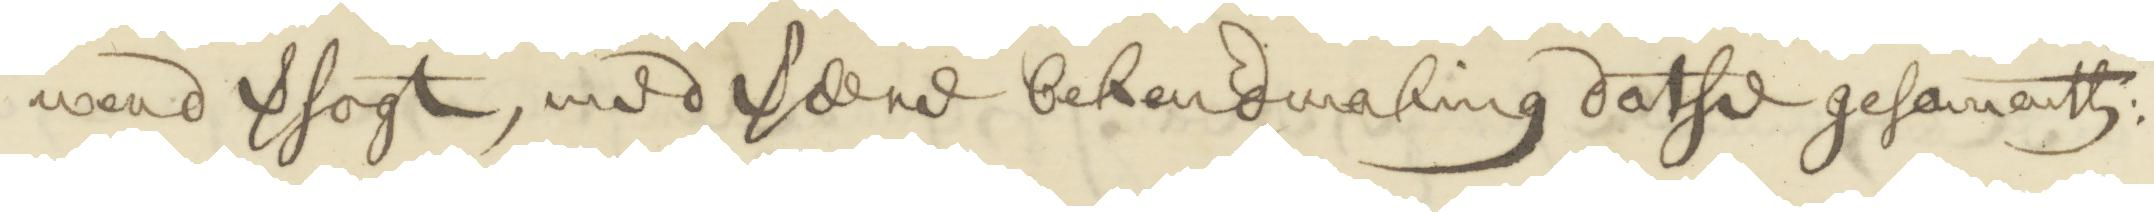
werd versogt, med verdere bekendmaking datse gesamentlijk
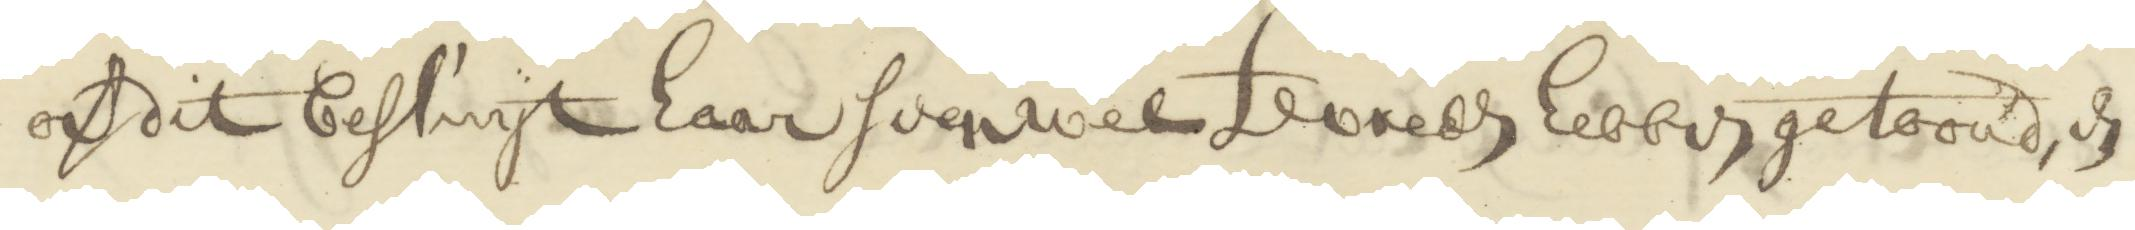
over dit besluijt haar selv wel te vreden hebben getoond, en
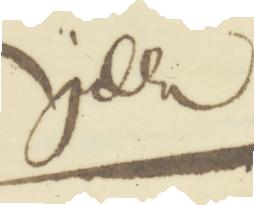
ijder
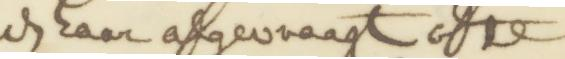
en haar afgevraagt of te
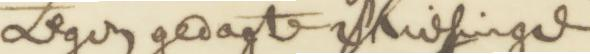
tegen gedagte verkiesinge
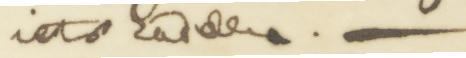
iets hadden.—
